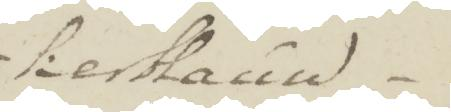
=kerblauw -
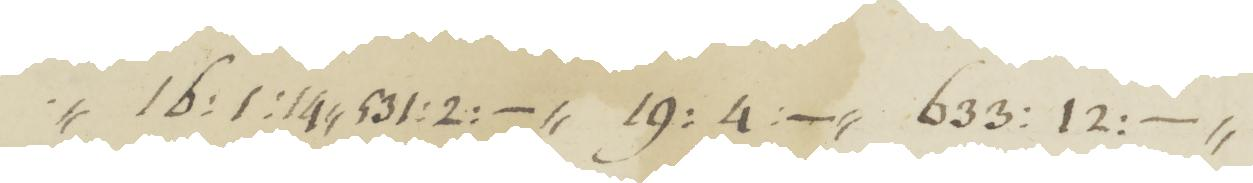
„ 16: 1:14„531:2:—„ 19: 4:—„ 633:12:— „
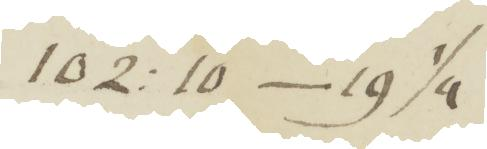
102: 10 — 19¼
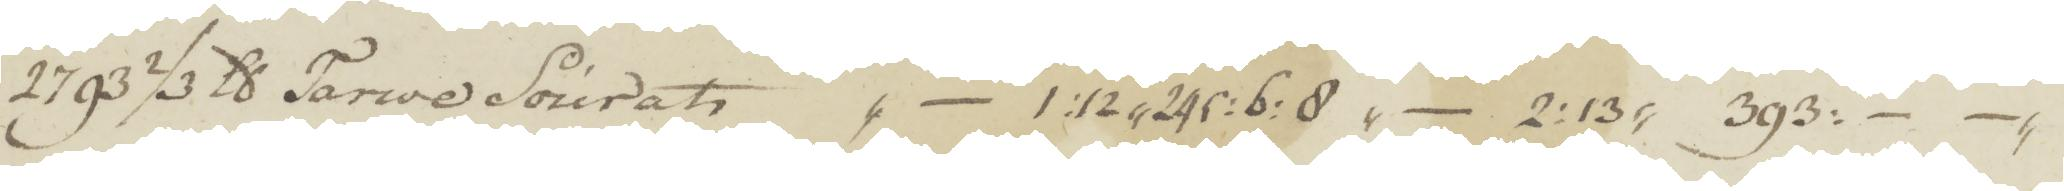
2793 2/3 lb Tarwe Sourat „— 1:12„245:6:8 „ — 2: 13 „ 393. — —„
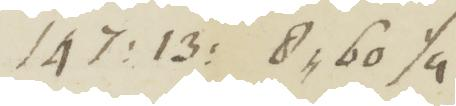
147:13: 8„ 50 ¼
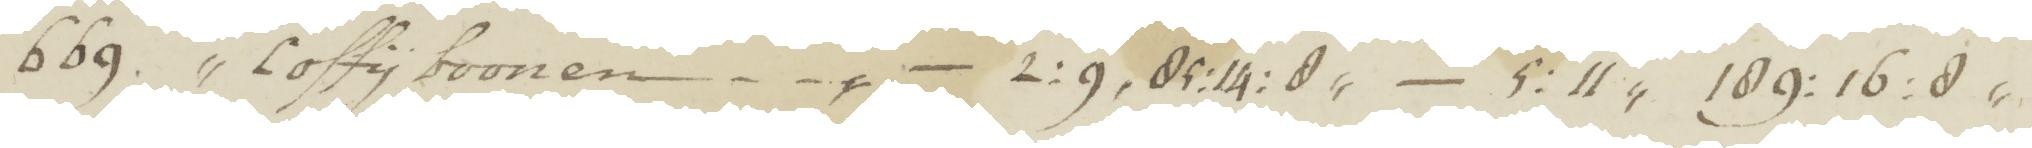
689. „ coffij boonen - - - „ — 2:9„ 85:14:8„ — 5: 11 „ 189:16:8 „
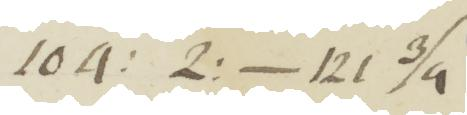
104: 2: — 121 ¾
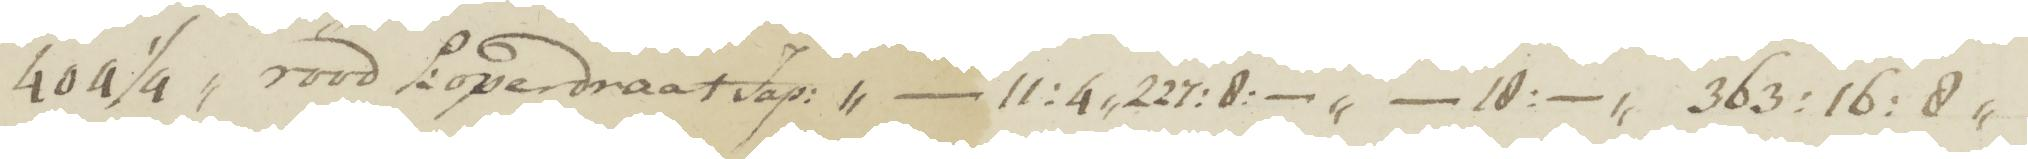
404¼ „ rood koperdraat Jap: „ — 11:4„227: 8: — „ — 18:— „ 363: 16: 8 „
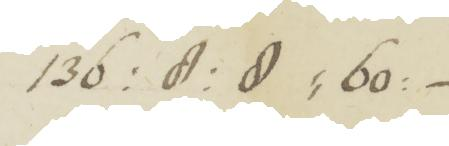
136: 8: 8 „ 60:-
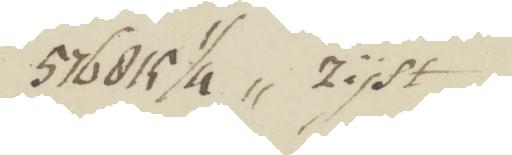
576815¼ „ rijst
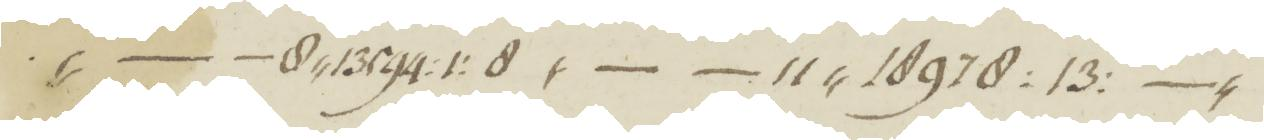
„ — — 8 „13594:1:8 „ — — 11„ 18978:13: —„
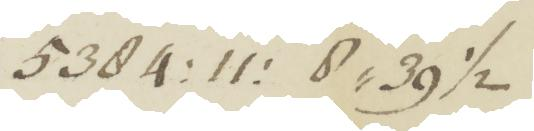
5384: 11: 8„ 39½
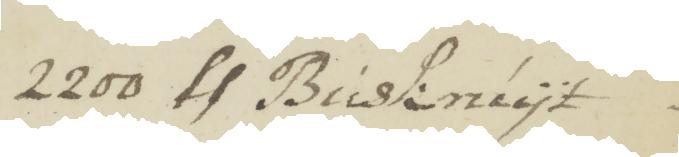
2200 lb Buskruijt
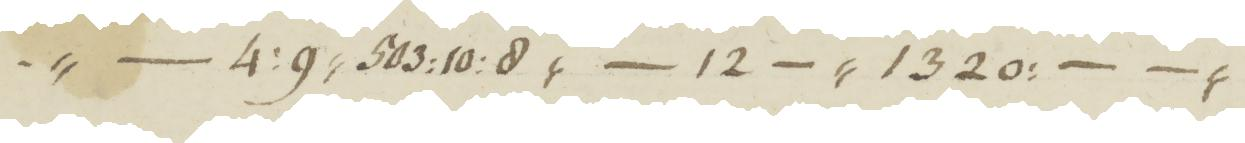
„ — 4:9„ 503:10: 8 „ — 12 — „ 1320: — —
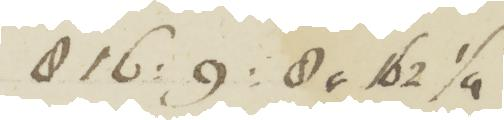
816: 9: 8 „ 162¼
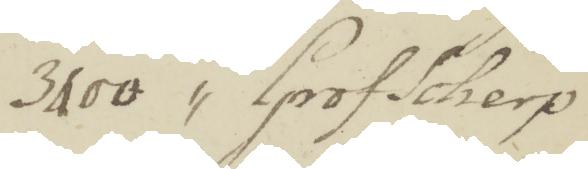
3400 „ Grofscherp
